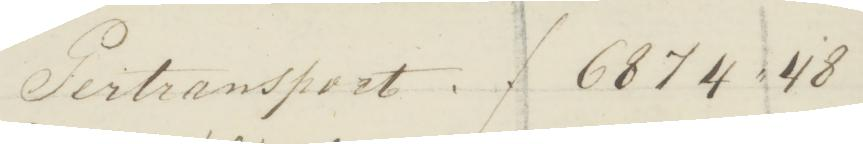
Pertransport. ƒ 6874 „ 48
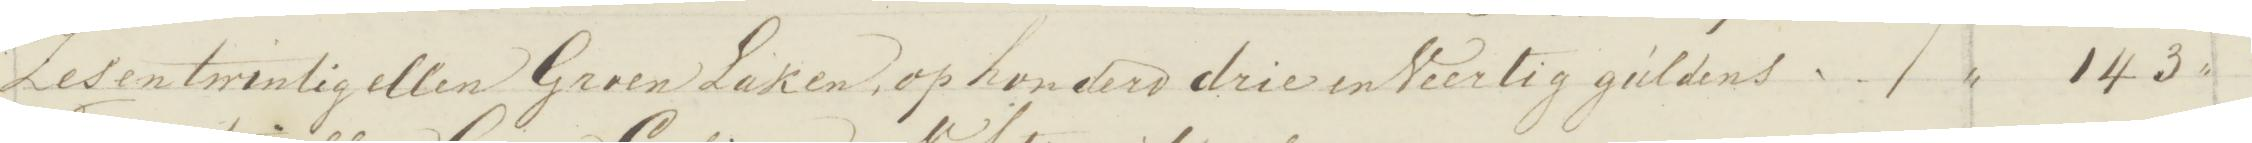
Zesen twintig ellen Groen Laken, op honderd drie en Veertig guldens - - „ 143„
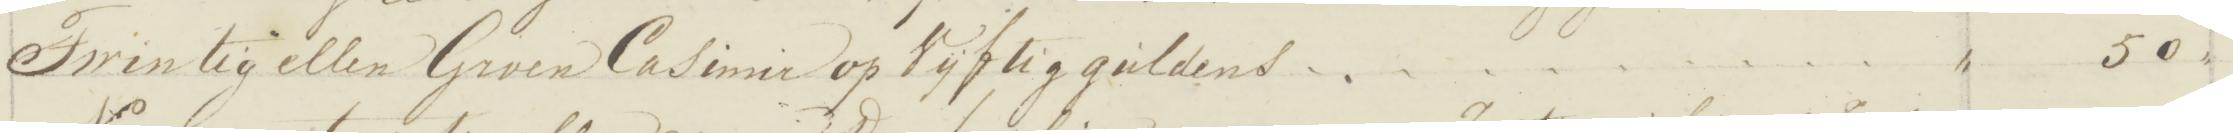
Twintig ellen Groen Casimir op Vijftig guldens - - - - - - - - - „ 50„
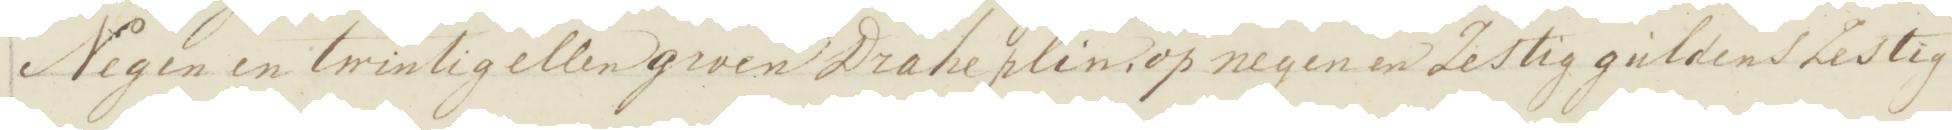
Negen en twintig ellen groen Draheplin , op negen en Zestig guldens Zestig
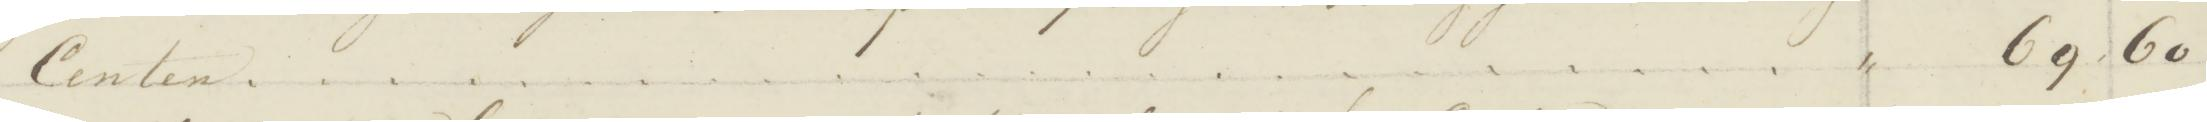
Centen - - - - - - - - - - - - - - - - - - - - - - - - - „ 69 „60
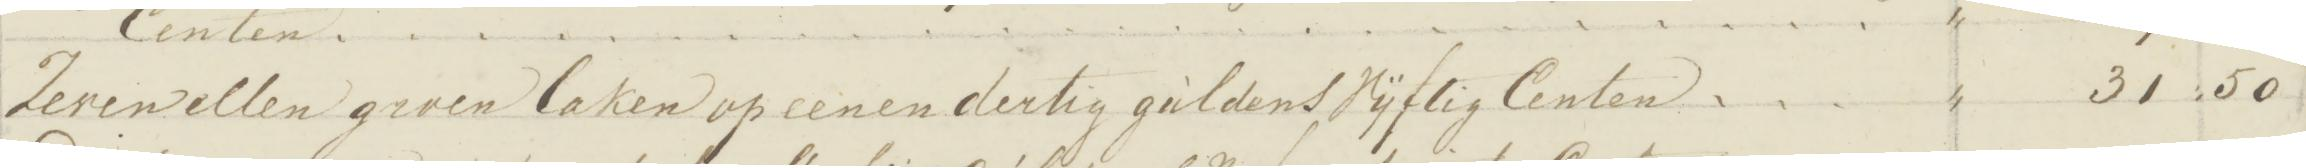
Zeven ellen groen laken op eenen dertig guldens Vijftig Centen - - - „ 31 „50
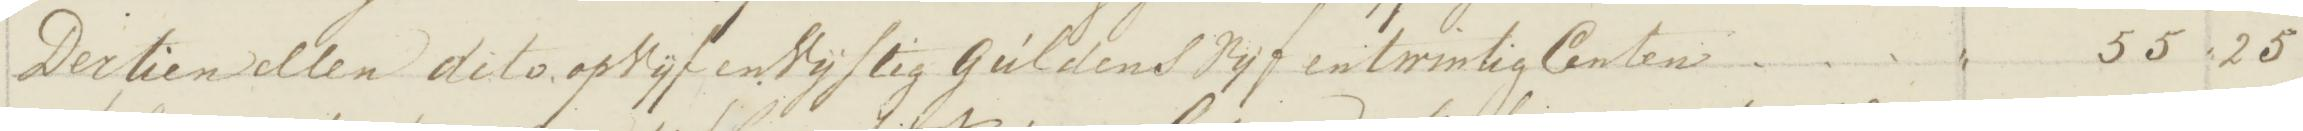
Dertien ellen dito, op Vijf en Vijftig Guldens Vijf entwintig Centen - - - „ 55 „25
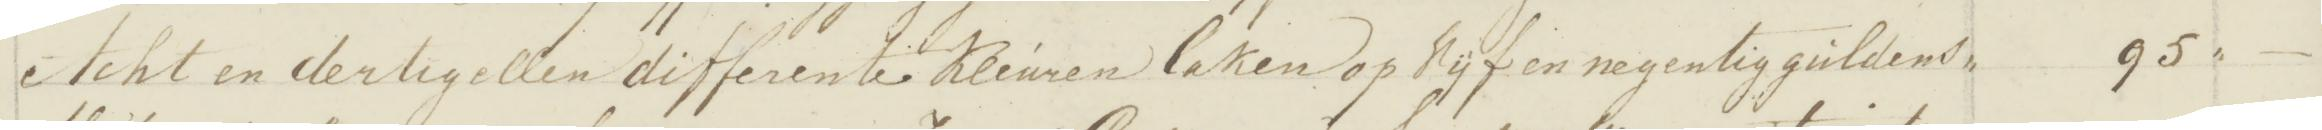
Acht en dertig ellen differente Kleuren laken op Vijf en negentig guldens „ 95 „ —
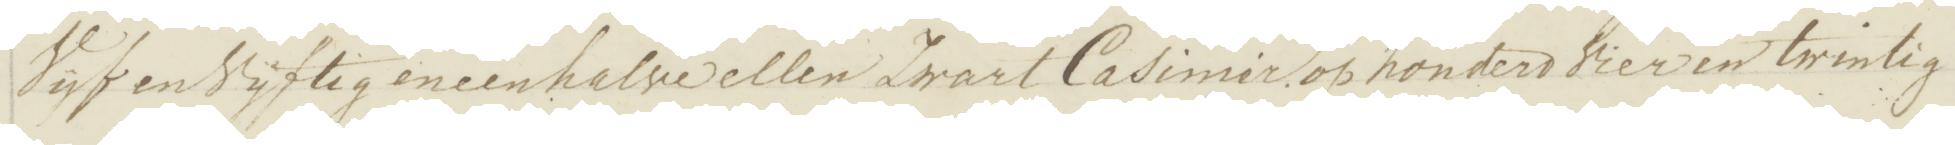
Vijf en Vijftig en een halve ellen Zwart Casimir, op honderd Vier en twintig
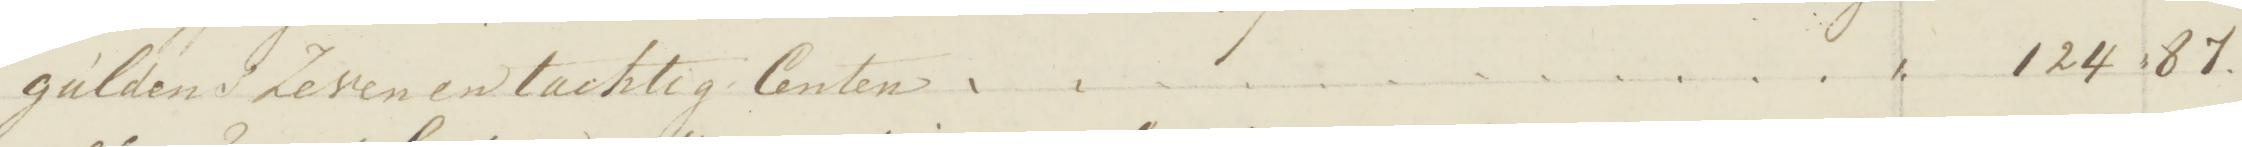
guldens Zeven en tachtig Centen - - - - - - - - - - - - „124 „87
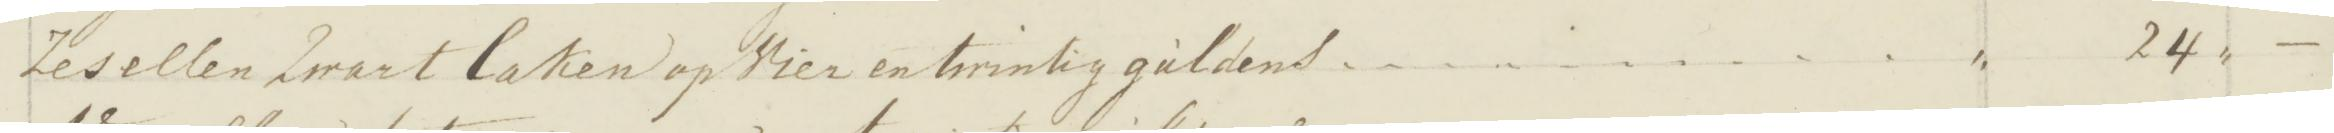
Zes ellen Zwart laken op Vier en twintig guldens - - - - - - - - - „ 24 „ —
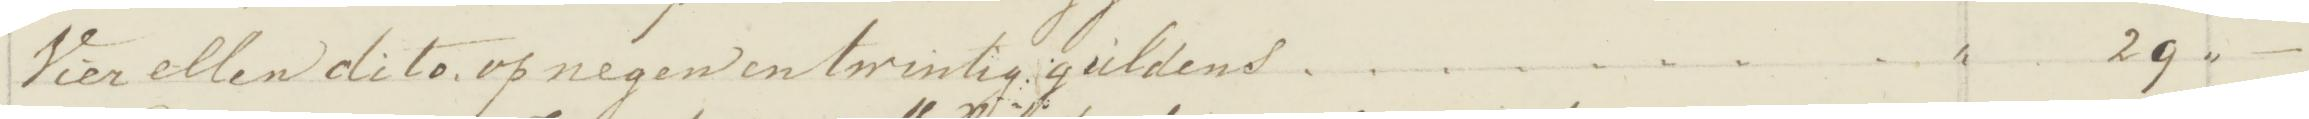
Vier ellen dito, op negen entwintig guldens - - - - - - - - „ 29 „ —
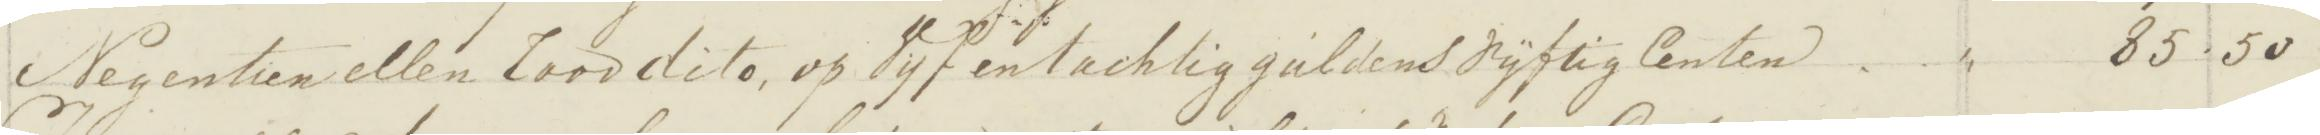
Negentien ellen Rood dito, op Vijf entachtig guldens Vijftig Centen - - „ 85 „50
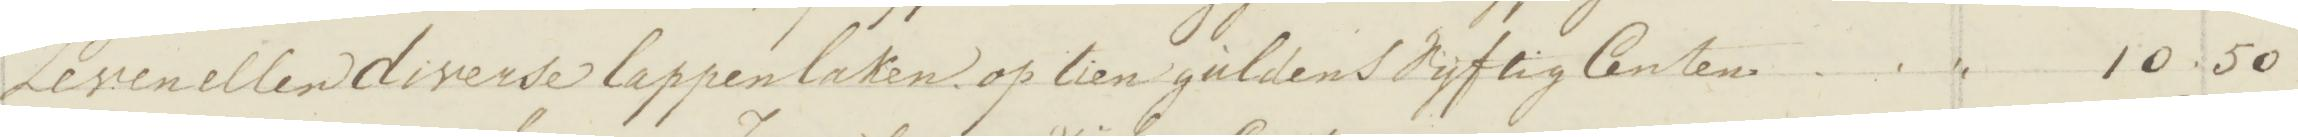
Zeven ellen diverse lappen laken op tien guldens Vijftig Centen - - „ 10 „50
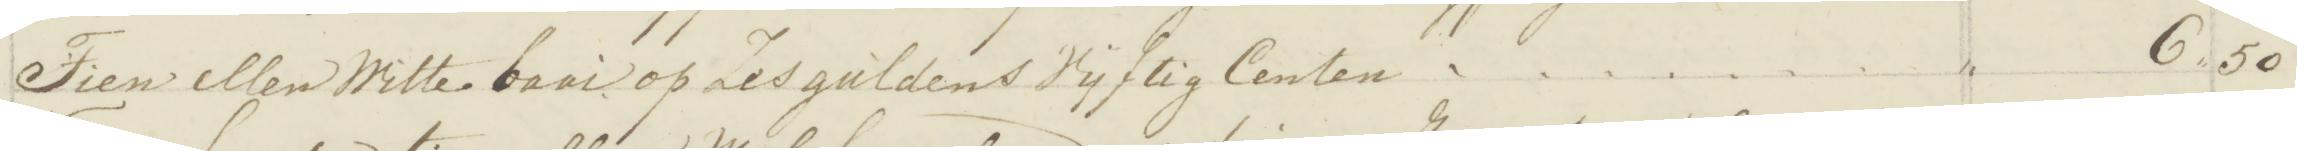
Tien ellen Witte baai op Zes guldens Vijftig Centen - - - - - - „ 6 „50
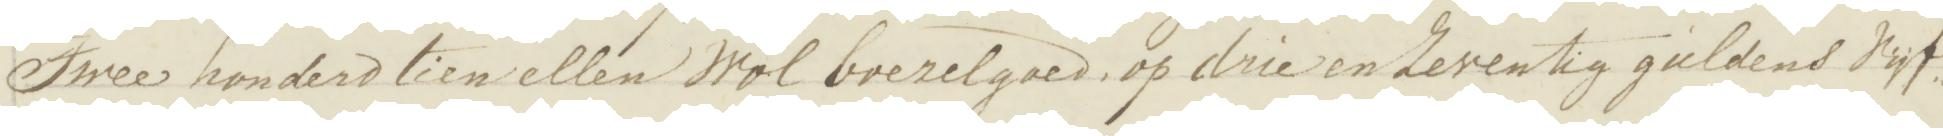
Twee honderd tien ellen Wol boezelgoed op drie en Zeventig guldens Vijf„
